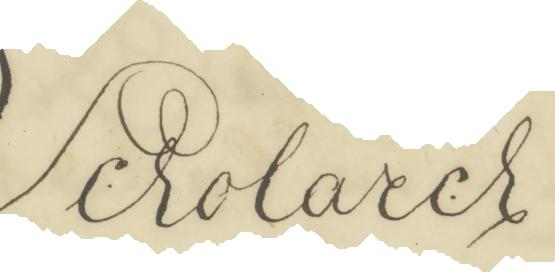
Scholarch
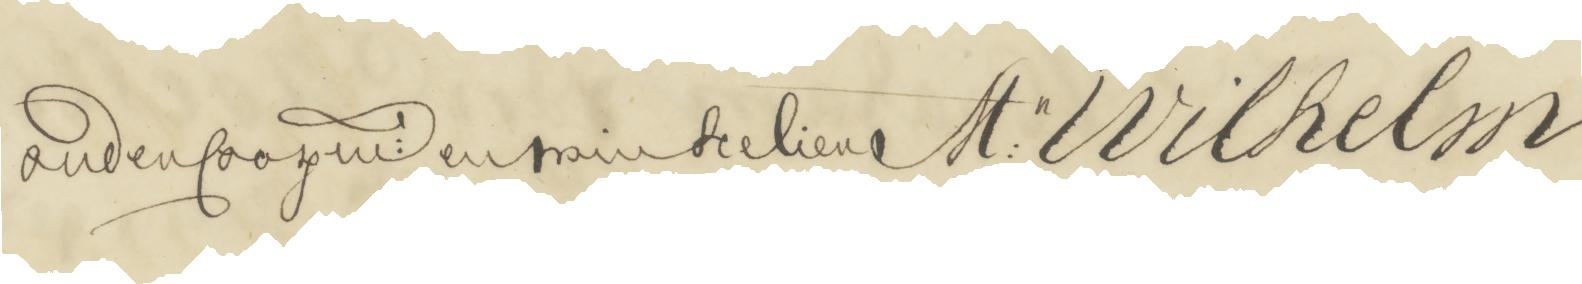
ondercoopm: en winkelier M:r Wilhelm
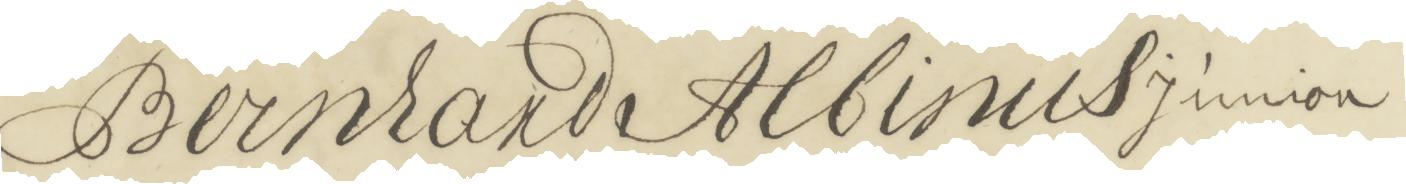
Bernhard Albinus junior
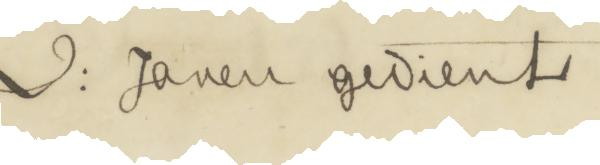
2: Jaren gedient
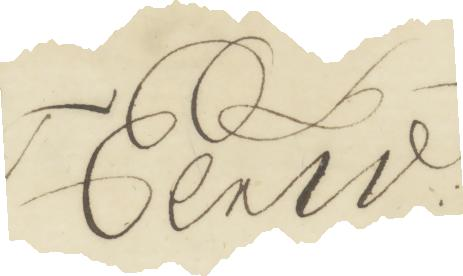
'T Eerne:
